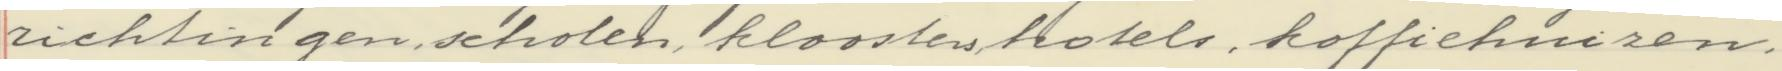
richtingen, scholen, kloosters, hotels, koffiehuizen,
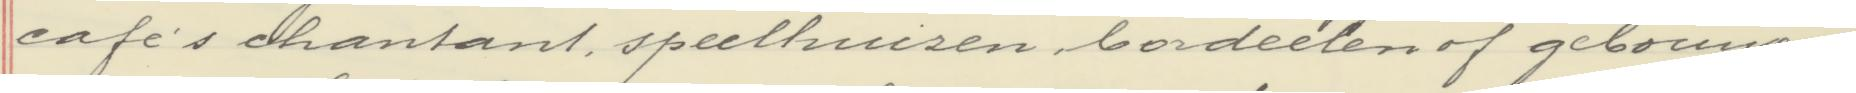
cafe's chantant, speelhuizen, bordeelen of gebouwen
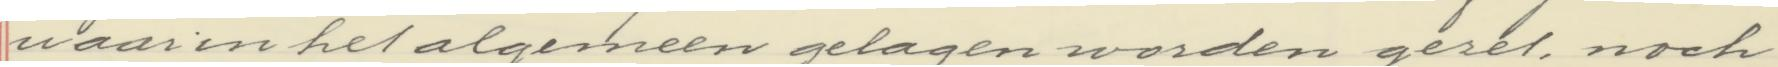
waar in het algemeen gelagen worden gezet, noch
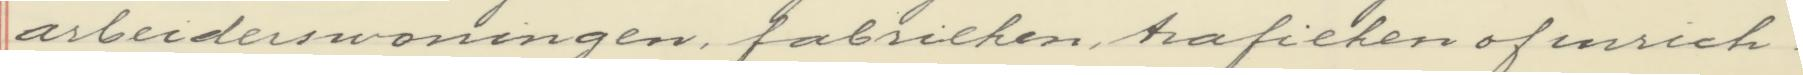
arbeiderswoningen, fabrieken, trafieken of inrich
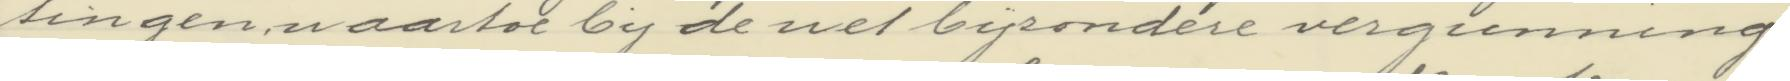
tingen, waartoe bij de wet bijzondere vergunning
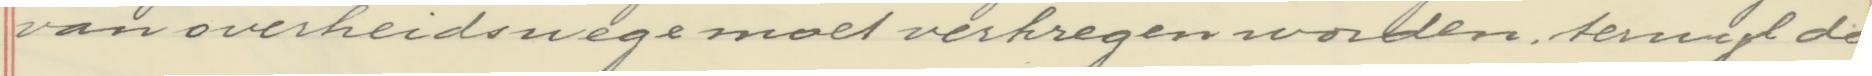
van overheidswege moet verkregen worden, terwyl de
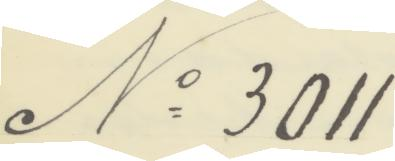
N=o 3011
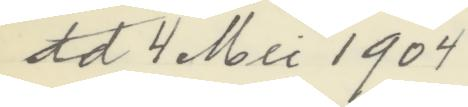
dd 4 Mei 1904
